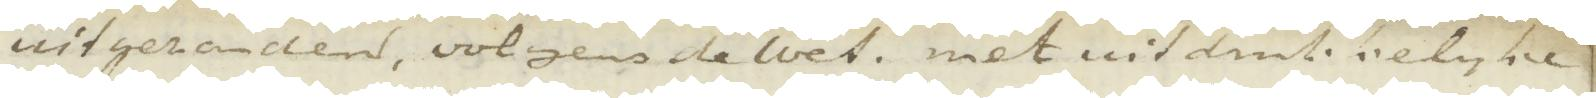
uitgezonderd, volgens de wet, met uitdrukkelyke
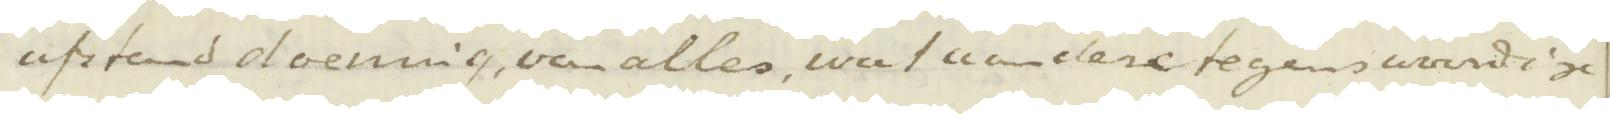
afstand doening, van alles, wat aan deze tegenswoordige
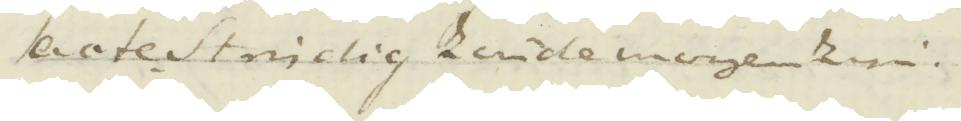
acte strijdig zoude mogen zyn.
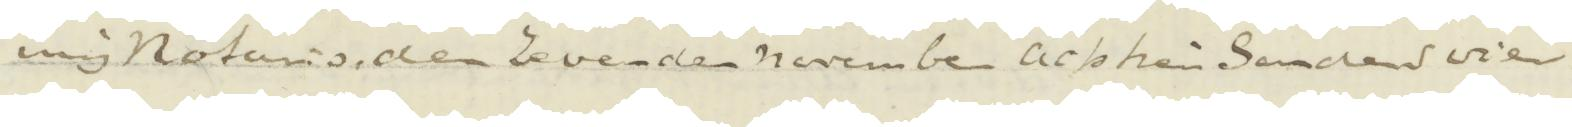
mij Notaris, den Zevenden november achtien honderd vier
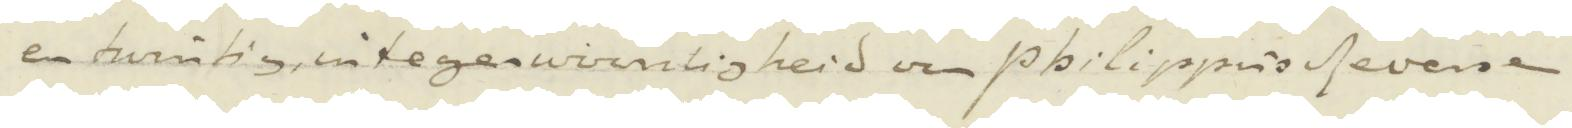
en twintig, in tegenwoordigheid van Philippus Revers en
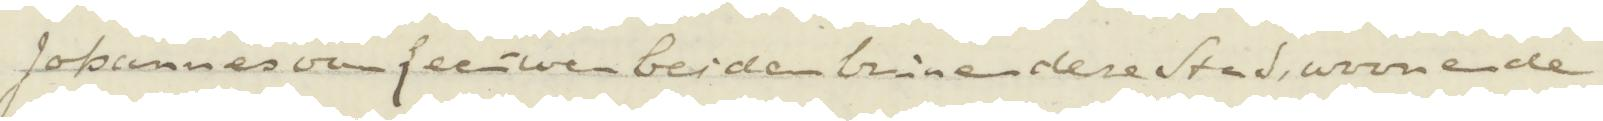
Johannes van Leeuwen beiden binnen deze stad, woonende
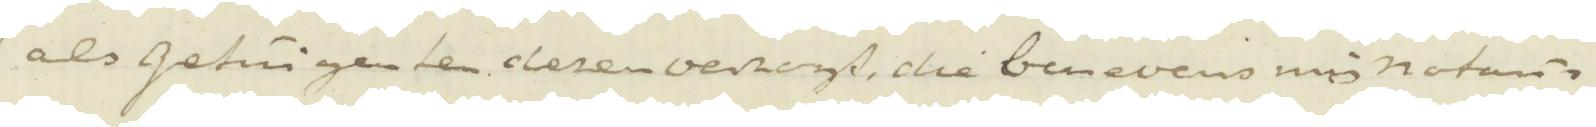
als Getuigen ten dezen verzogt, die benevens mij notaris
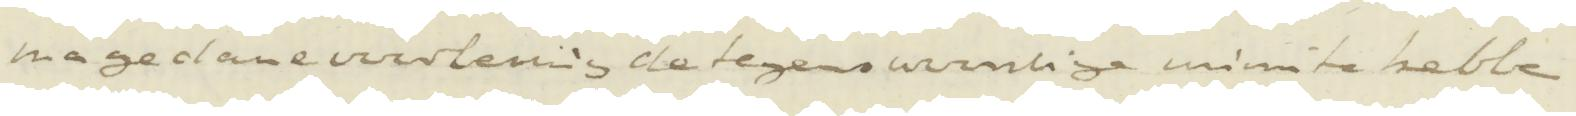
na gedane voorlezing de tegenswoordige minute hebben
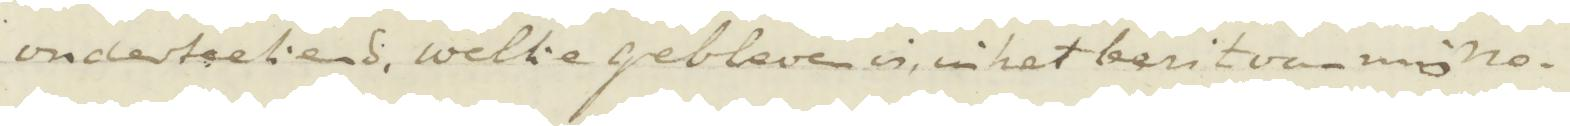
onderteekend, welke gebleven is, in het bezit van mij no=
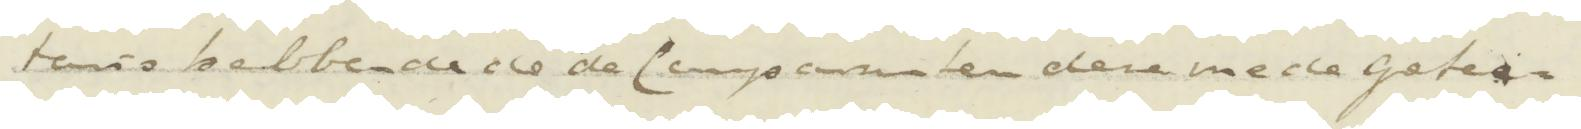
taris hebbende de de Comparanten deze mede getee=
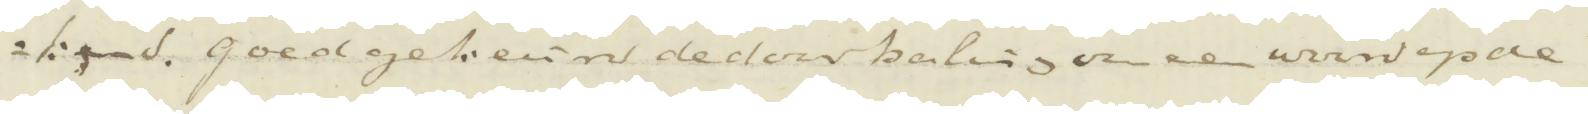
=kend Goedgekeurd de door haling van een woord op de
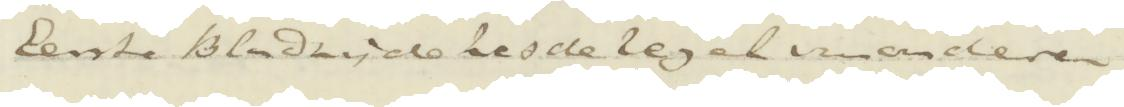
Eerste Bladzijde zesde regel van onderen
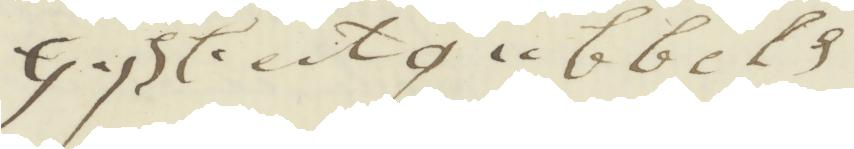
G:J. Slatgubbels
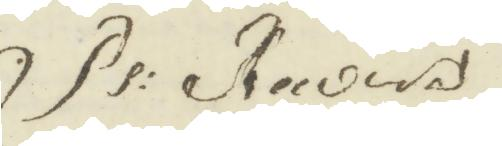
Ps: Revers
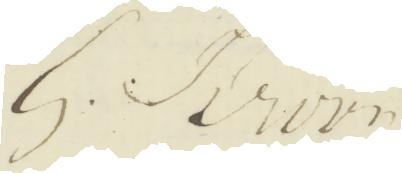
G.I Croon
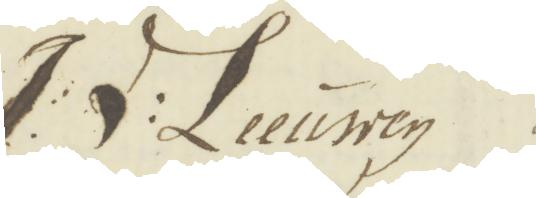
J:v: Leeuwen
